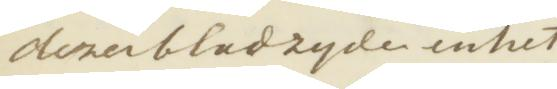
dezer bladzyde en het
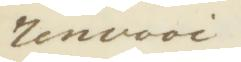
renvooi
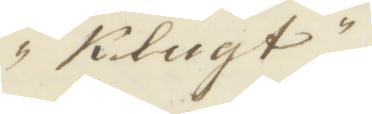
„ klugt „
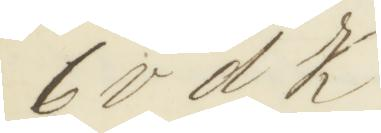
G v d K
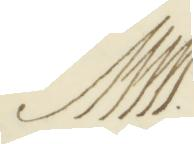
MW.
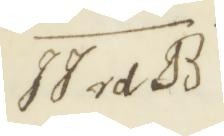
I I vd B
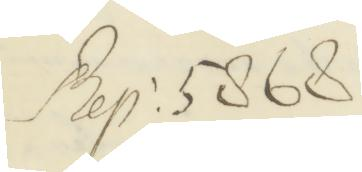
Rep: 5868
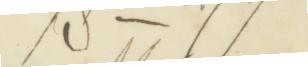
18 3/14 77
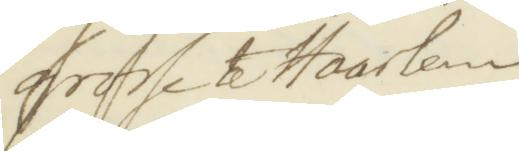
grosse te Haarlem
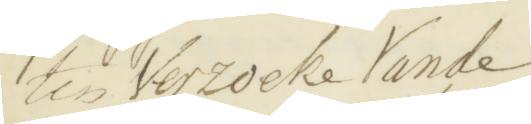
ten Verzoeke Vande
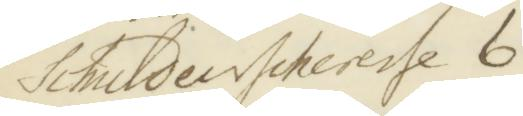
schuldeisscheresse 6
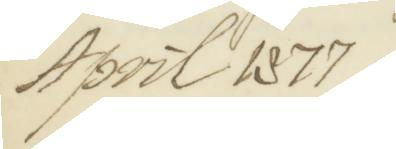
April 1877
